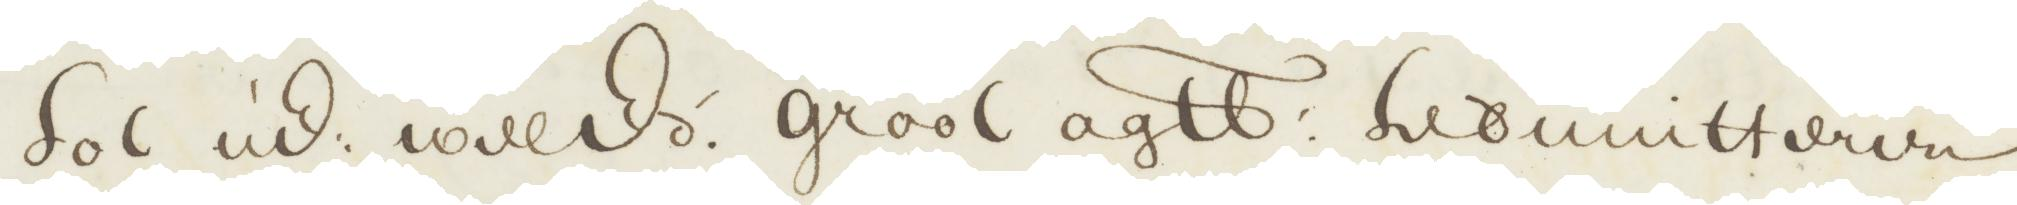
tot uE: wel Ed.' groot agtb: te dimitteren
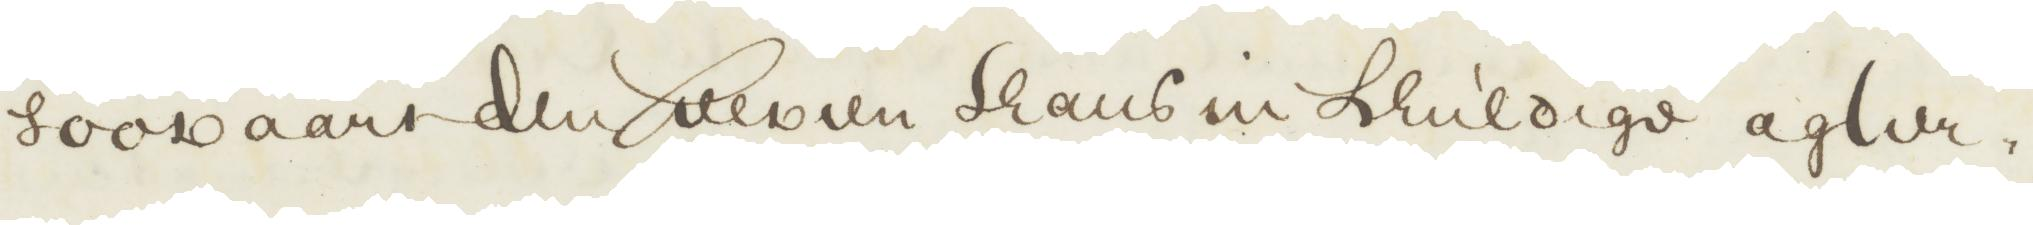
soovaart denselven thans in schuldige agter„
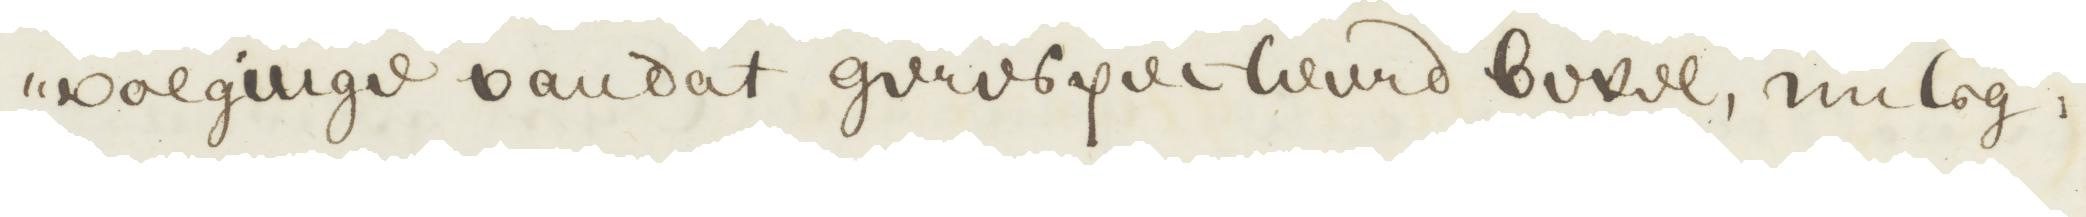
„volginge van dat gerespecteerd bevel, nu tog:
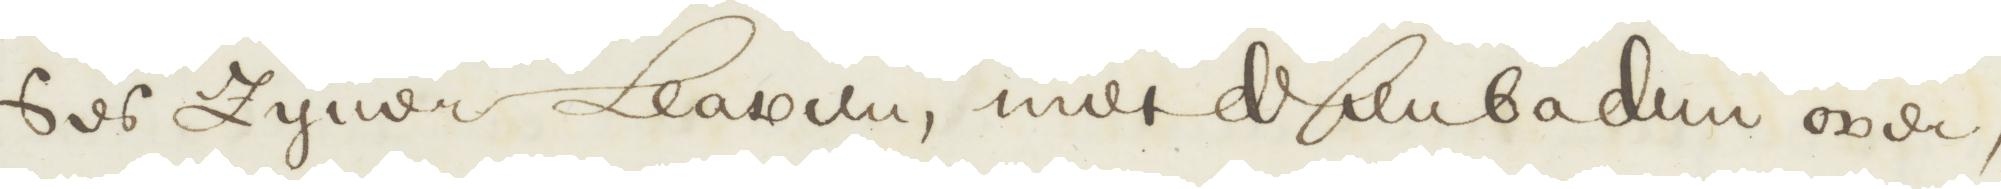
ses zijner slaven, met desen bodem over,
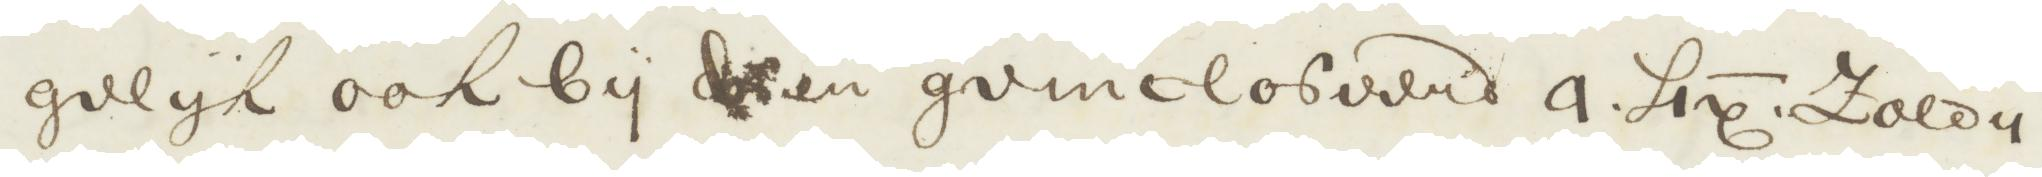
gelijk ook bij den geimcloseerd 4. six. zoldij
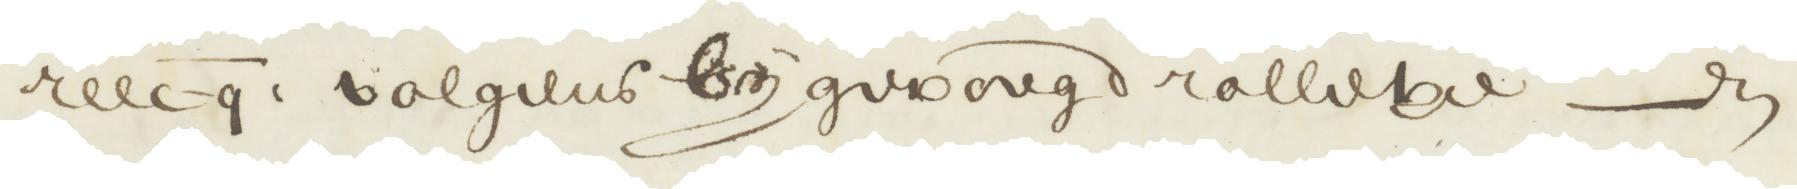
reecq: volgens bijgevoegd rolletje en
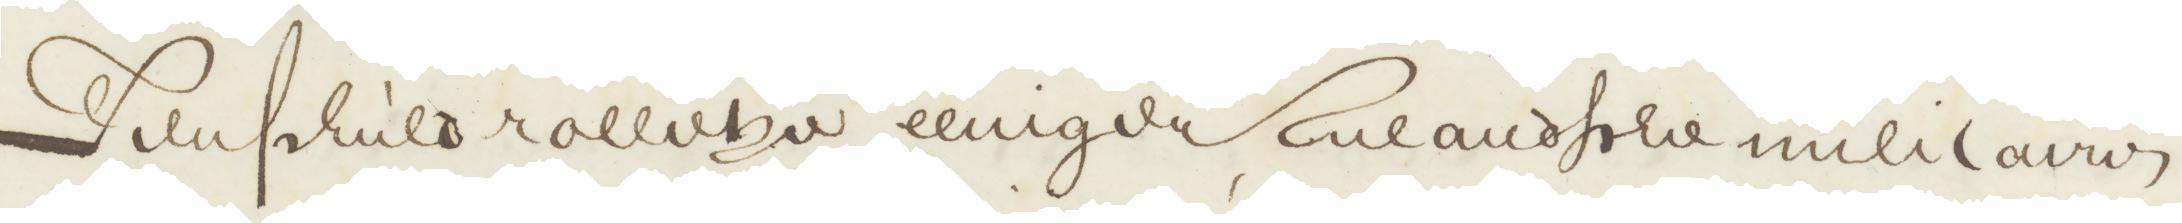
Een schuld rolletje eeniger jnlandsche militairen
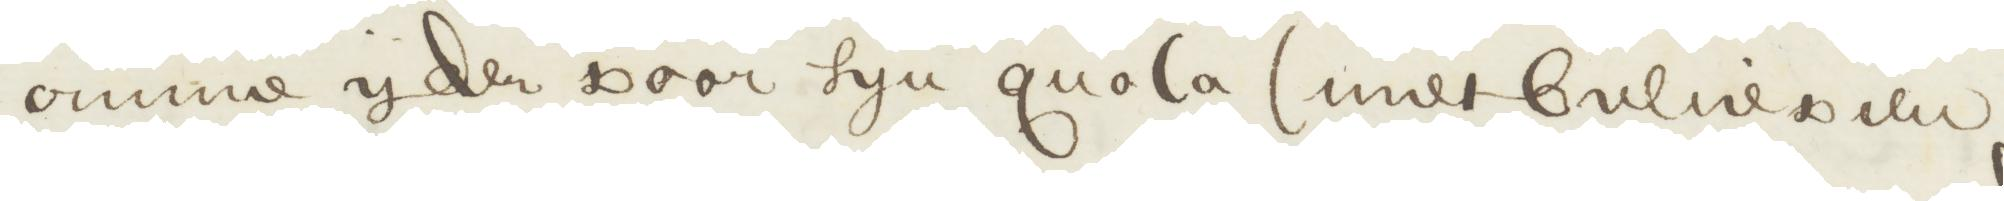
omme ijder voor sijn quota (met believen
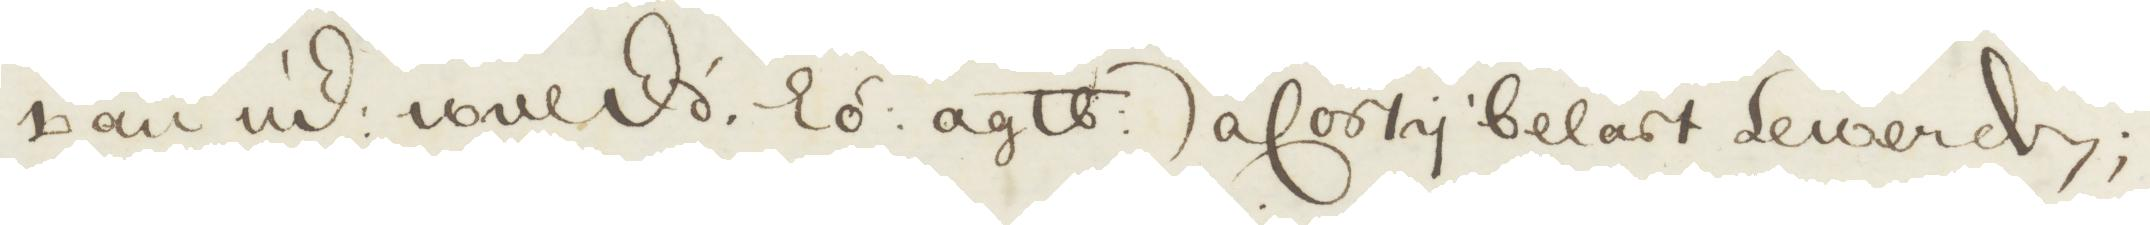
van uE: wel Ed.' ho: agtb: ) â costij belast te werden;
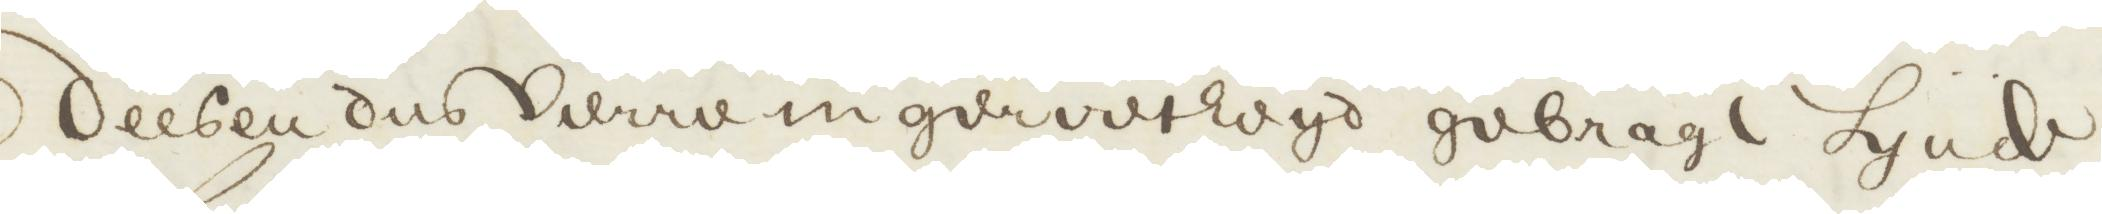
deesen dus verre in gereetheijd gebragt sijnde
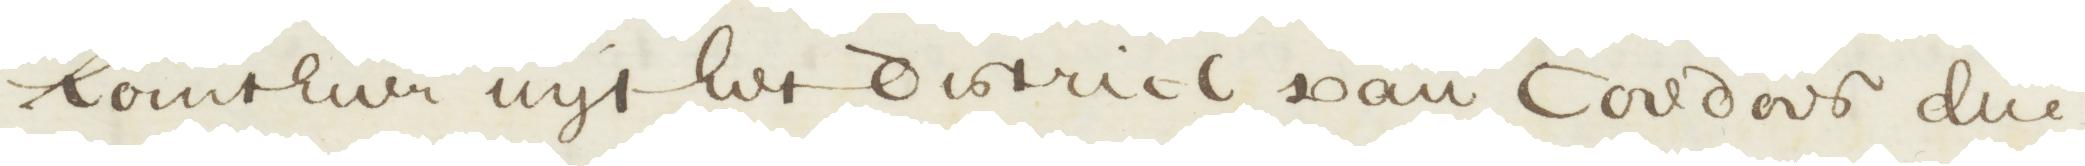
komt hier uijt het district van Coedoes die
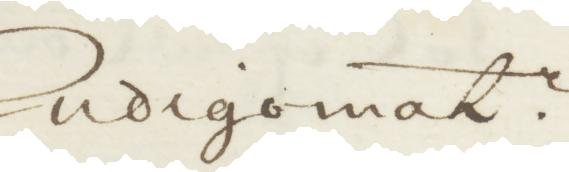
jndigomak.r
